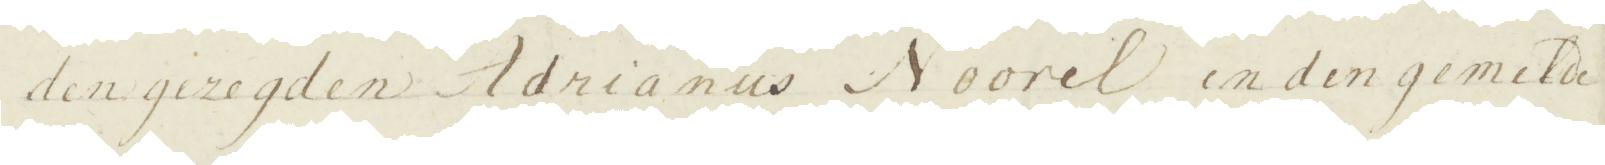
den gezegden Adrianus Noorel in den gemelde
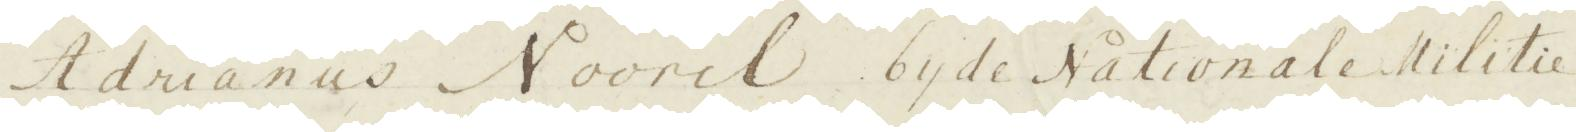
Adrianus Noorel by de Nationale Militie
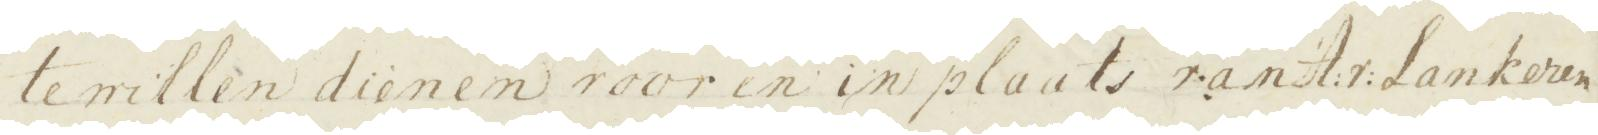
te willen dienen voor en in plaats van A: v: Lankeren
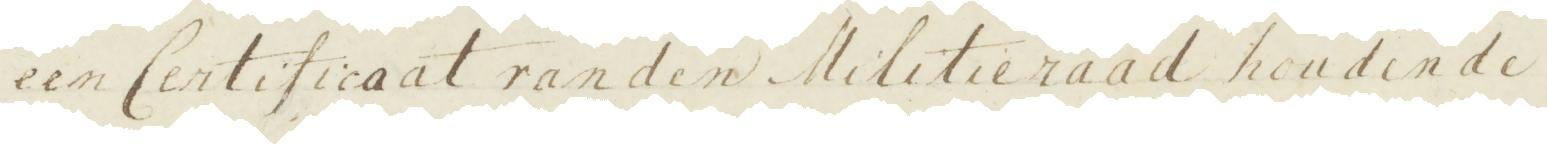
een Certificaat van den Militieraad houdende
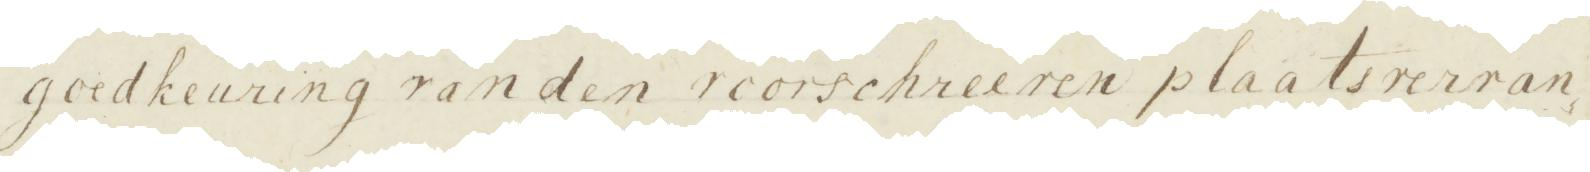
goedkeuring van den voorschreeven plaats vervan„
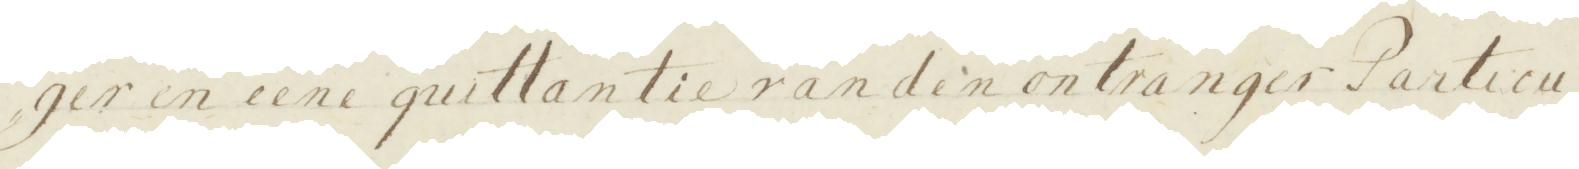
„ger en eene quittantie van den ontvanger Particu
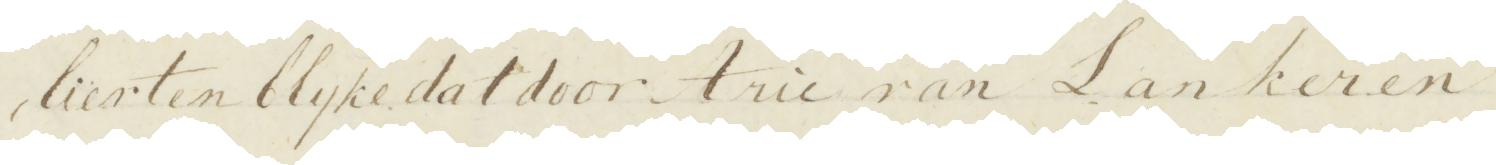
„lier ten blyke dat door Arie van Lankeren
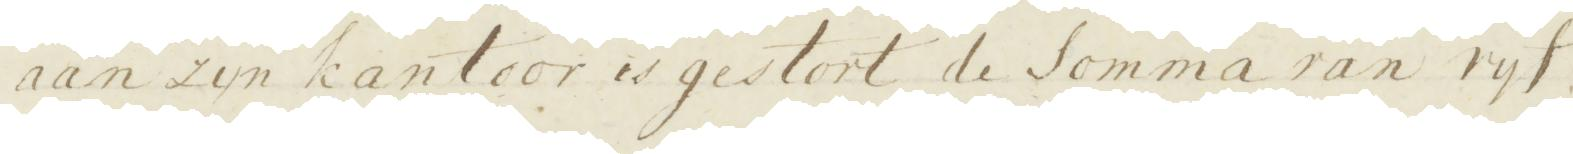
aan zyn kantoor is gestort de somma van vyf
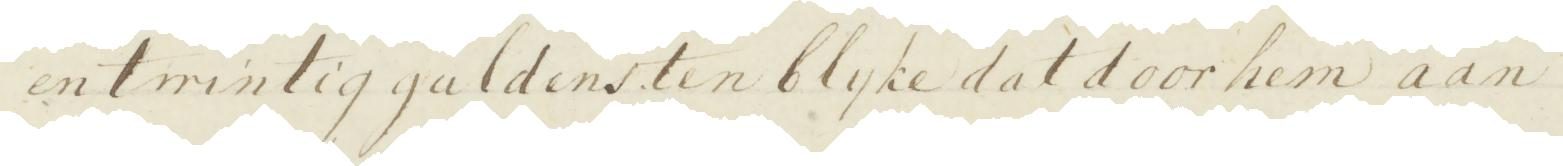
en twintig guldens ten blyke dat door hem aan
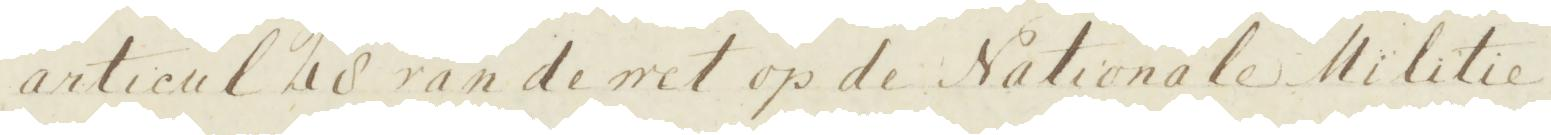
articul 48 van de wet op de Nationale Militie
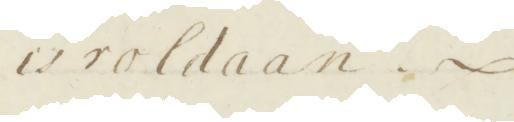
is voldaan . —
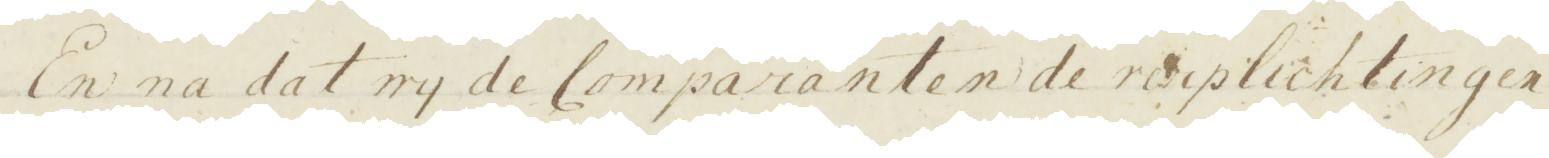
En na dat wy de Comparanten de verplichtingen
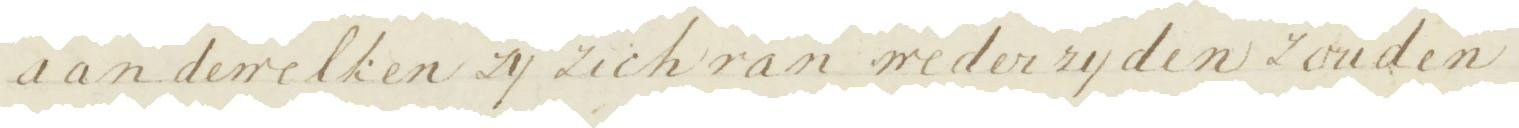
aan dewelken zy zich van wederzyden zouden
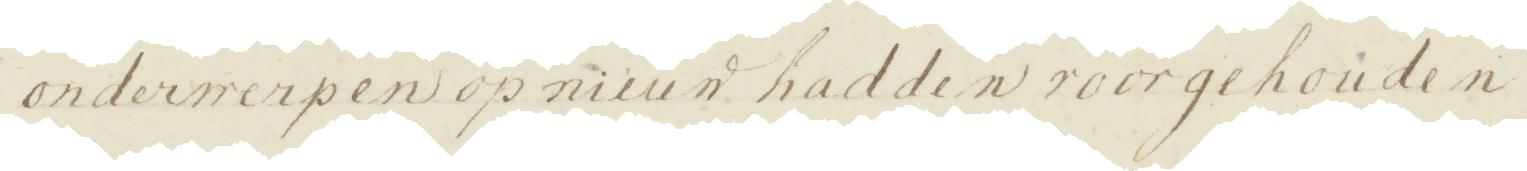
onderwerpen op nieuw hadden voorgehouden
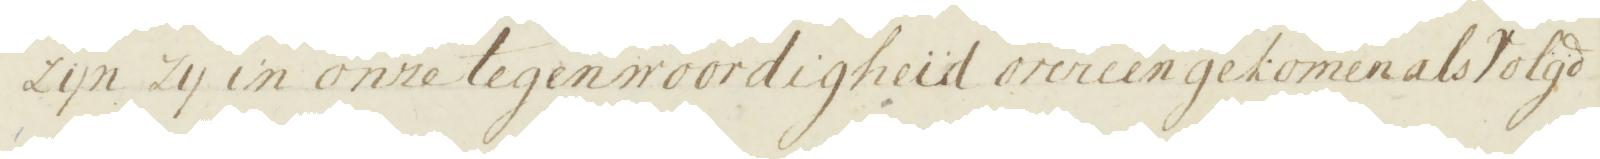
zyn zy in onze tegenwoordigheid overeen gekomen als Volgd
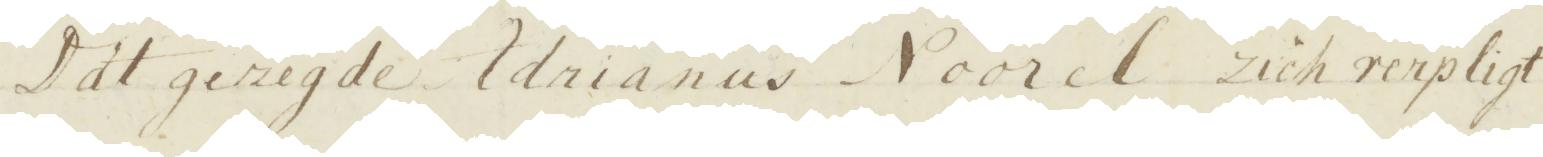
Dat gezegde Adrianus Noorel zich verpligt
